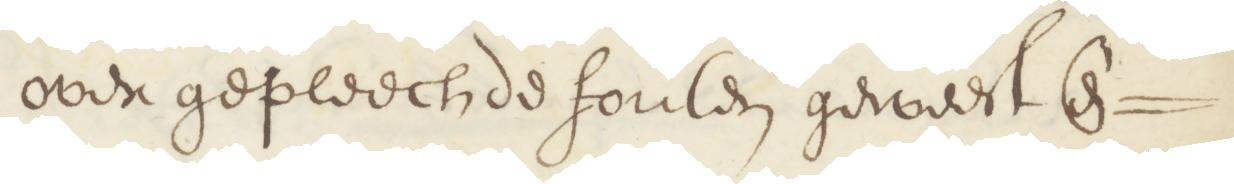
over gepleechde fouten geweest ende=
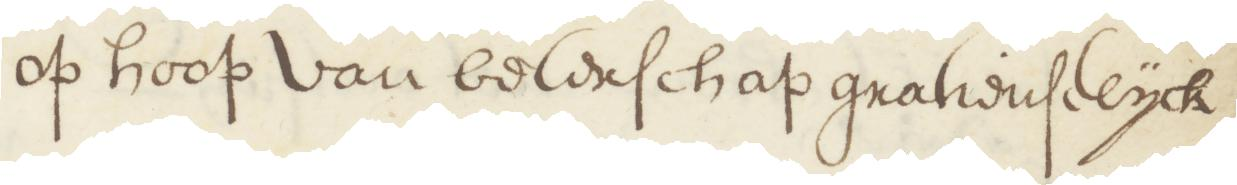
op hoop van beterschap gratienselijck
